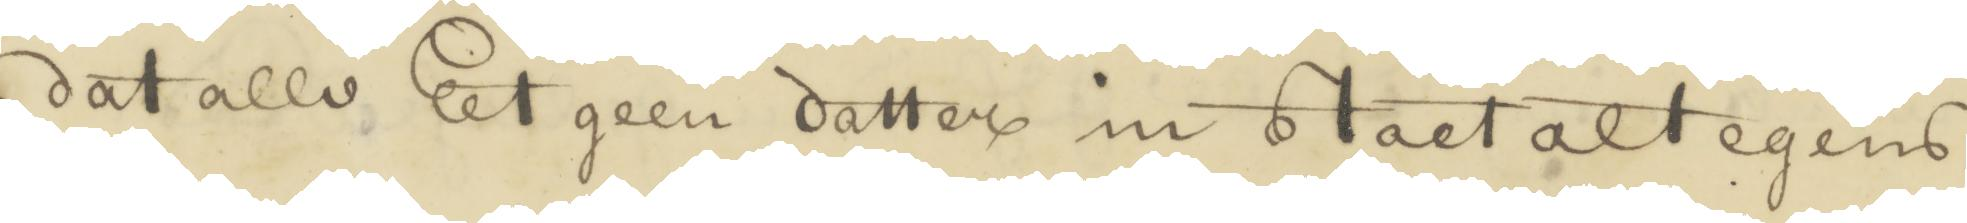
dat alle het geen datter in staet altegens
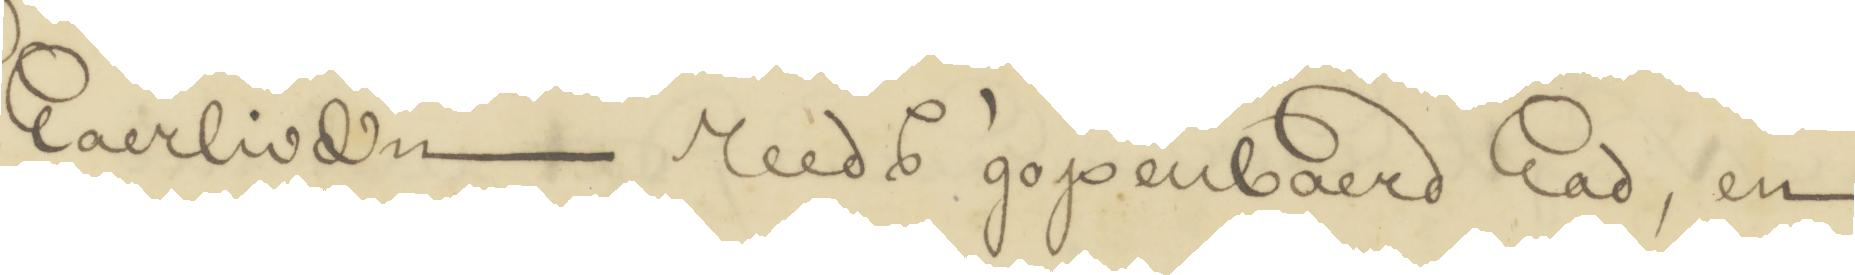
haerlieden reeds 'gopenbaerd had, en
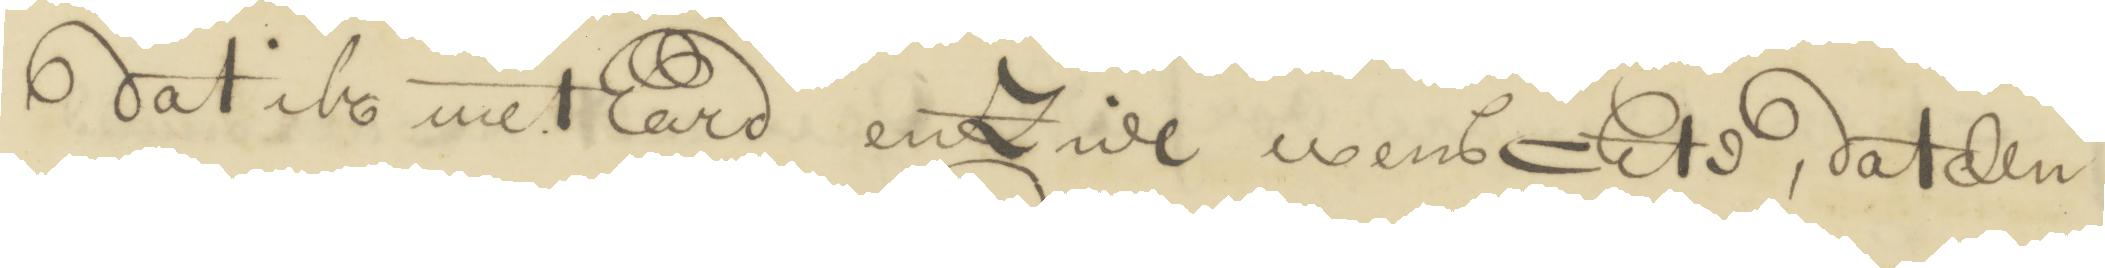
dat ik met hard en ziel wenschte, dat den
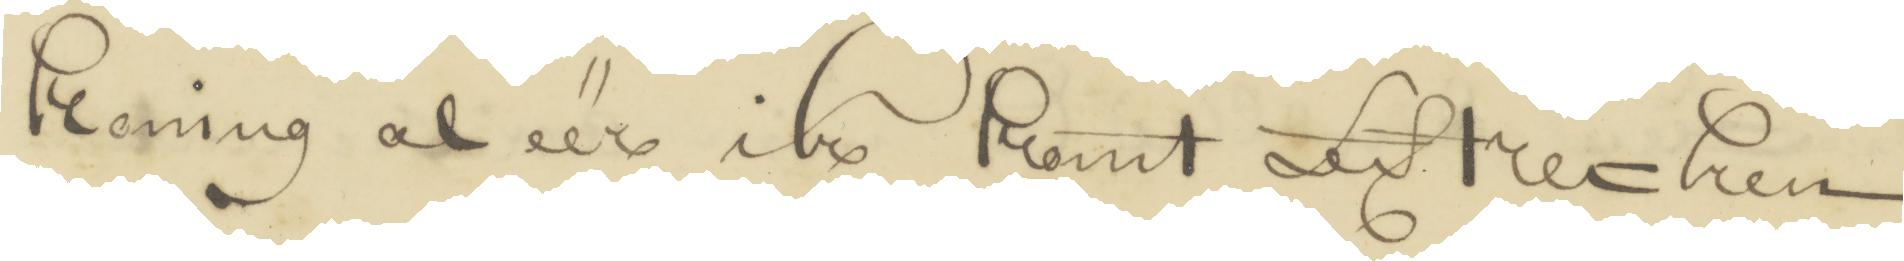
koning al eer ik komt te vertrecken
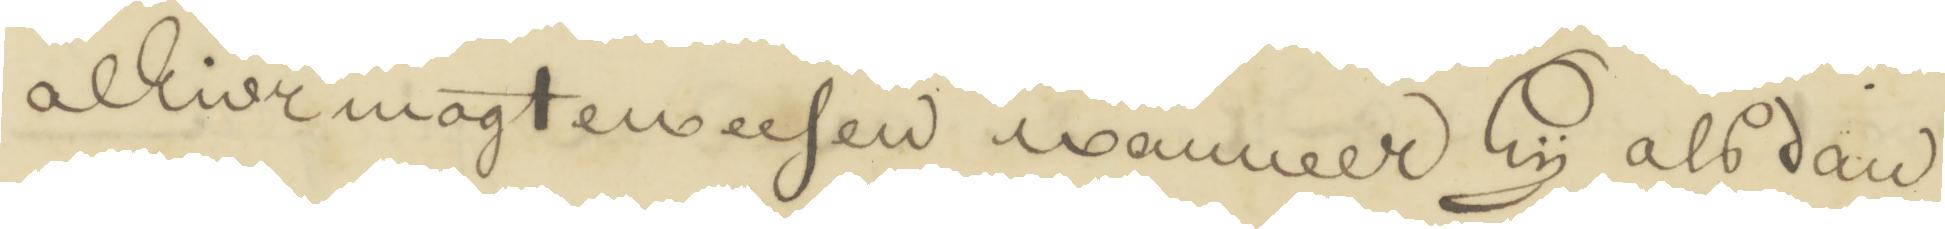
alhier mogteweesen wanneer hij als dan
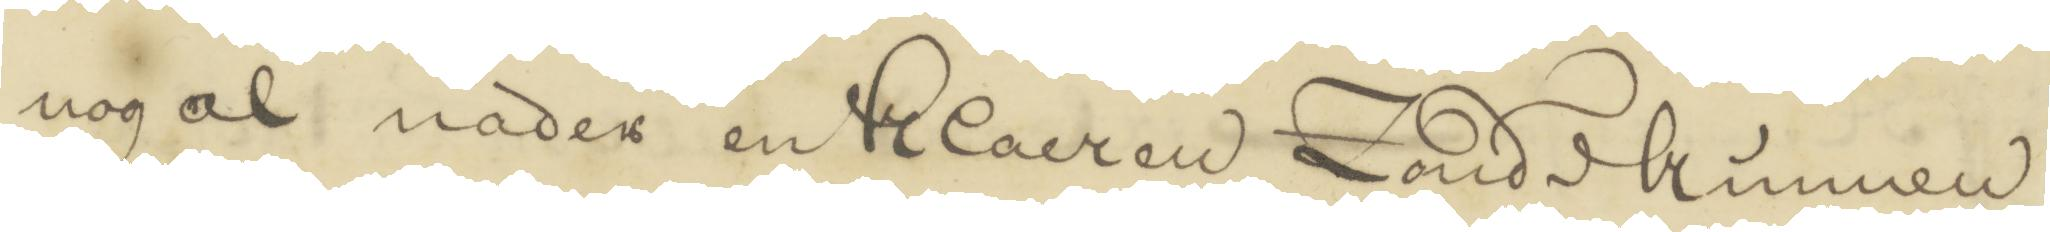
nog al nader en klaeren zoude kunnen
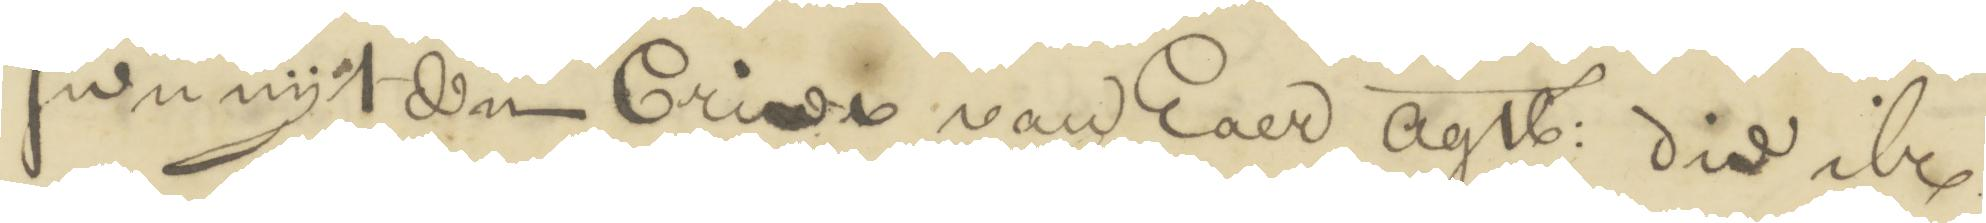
sien uijt den briev van haer agtb: die ik
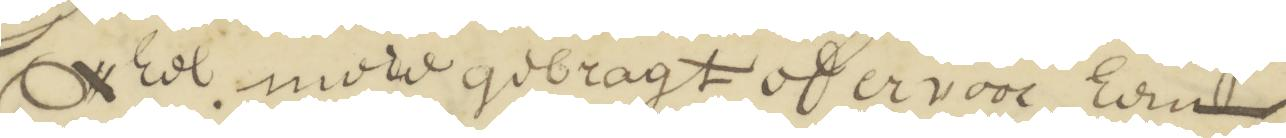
¶ heb mede gebragt of er voor hem
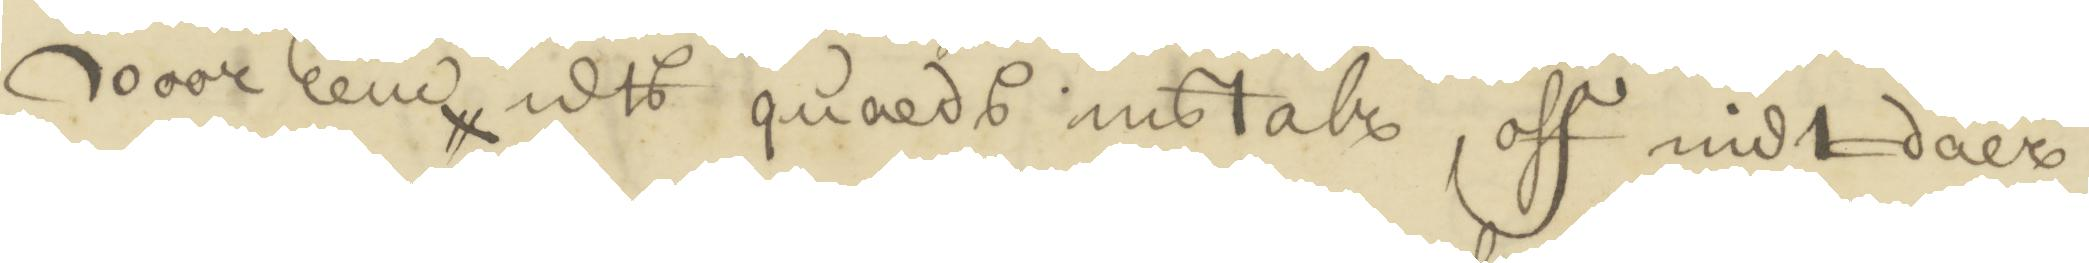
voor hem¶ iets quaeds instak, off niet daer
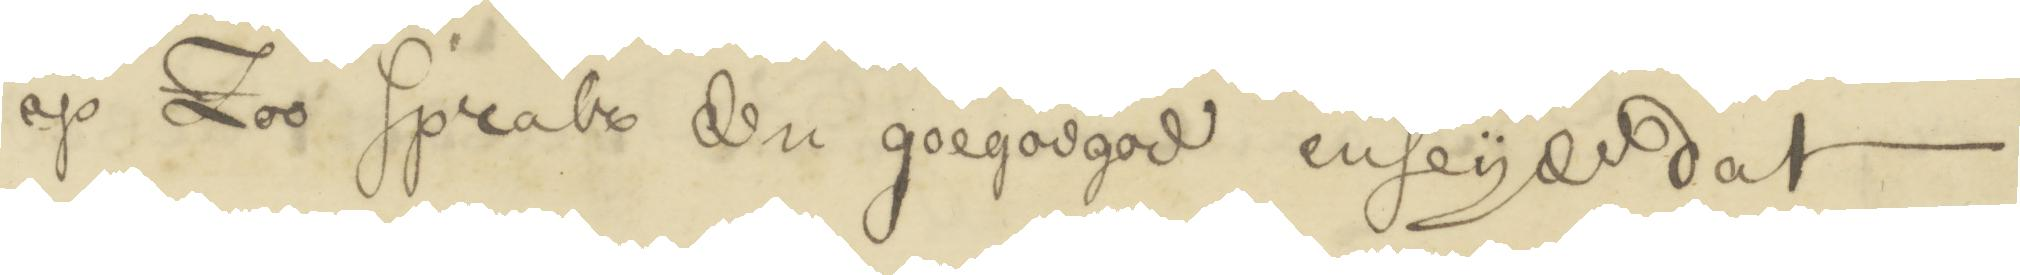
op zoo sprak den goegoegoe enseijde dat
